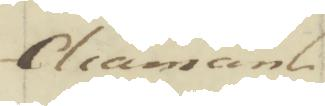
diamant
